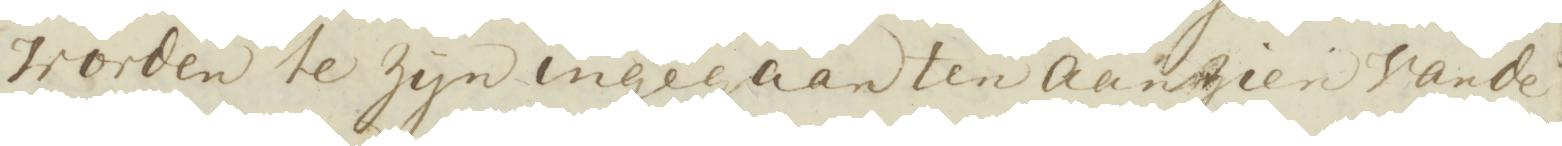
worden te zijn ingegaan ten aanzien van de
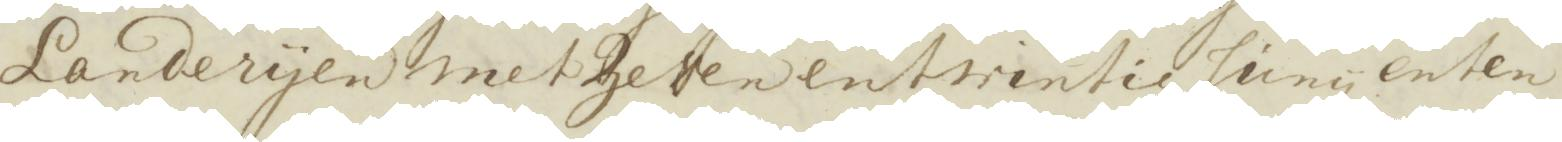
Landerijen met zeven en twintig Junij en ten
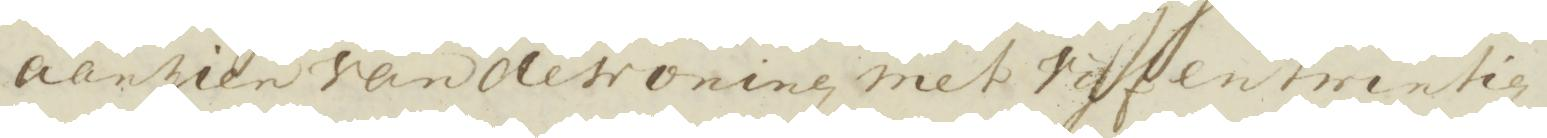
aanzien van de woning met vijf en twintig
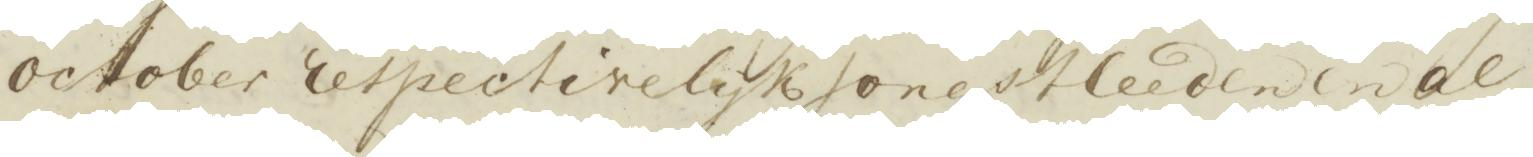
october respectivelijk Jongstleeden en al
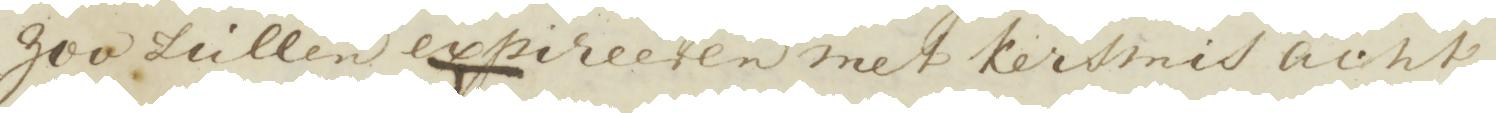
zoo zullen expireeren met kersmis acht
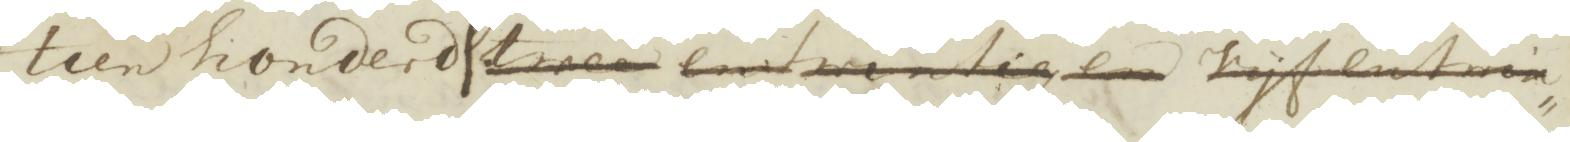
tien honderd ¶ Twee en twintig en vijf entwin„
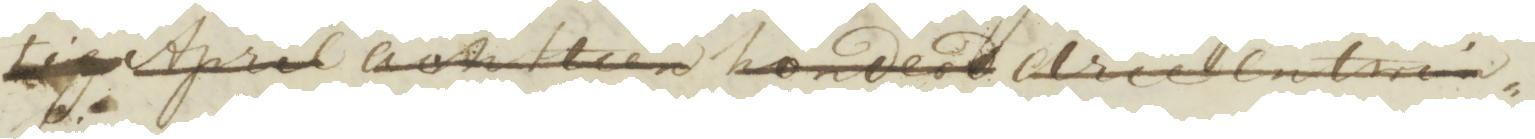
tig April achttien honderd drie en twin„
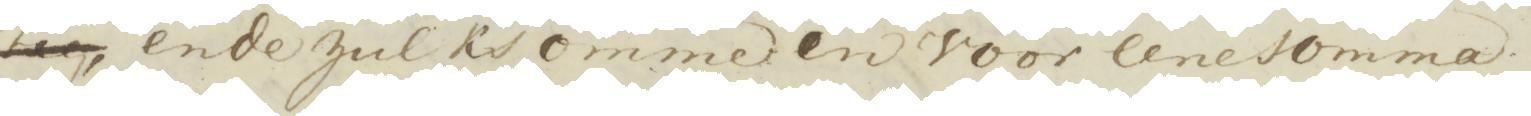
„tig, ende zulks omme en voor eene somma
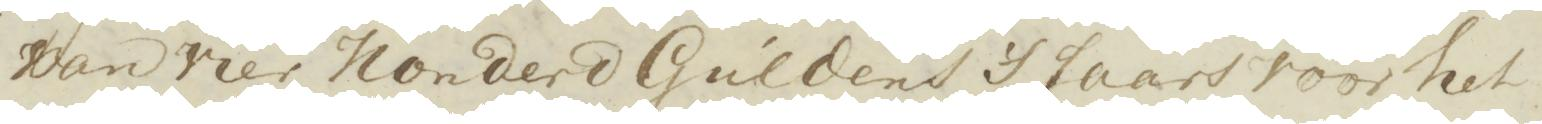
van vier Honderd Guldens 's Jaars voor het
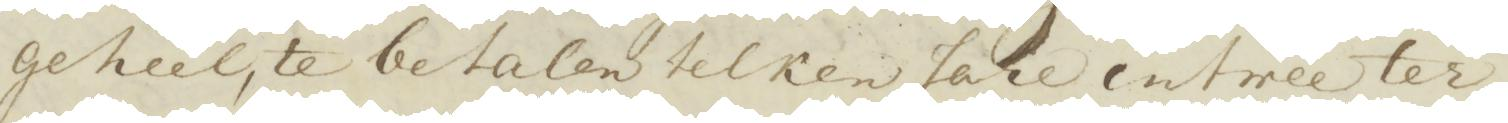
geheel, te betalen telken Jare in twee ter
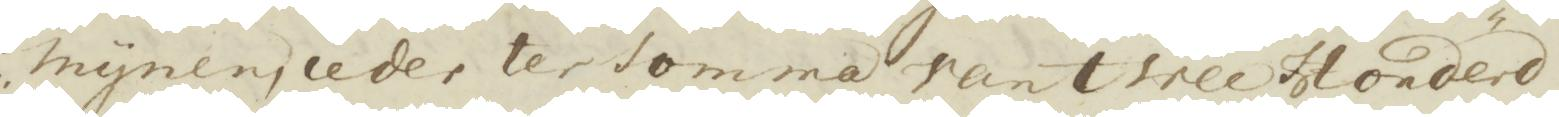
mijnen, ieder ter somma van twee Honderd
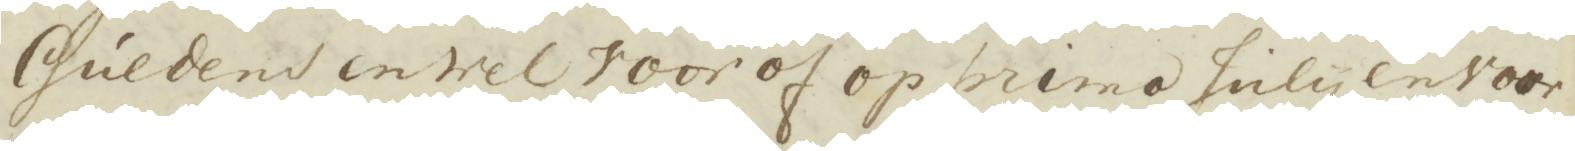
Guldens en wel voor of op primo Julij en voor
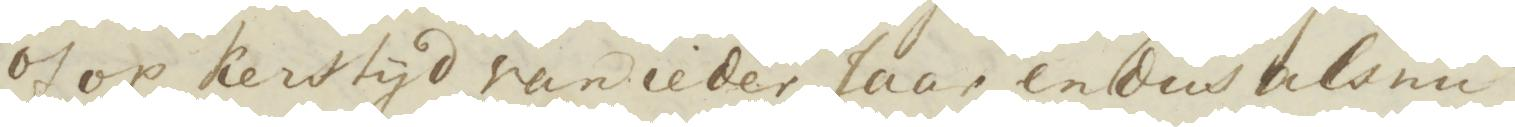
of op kerstijd van ieder Jaar en dus als nu
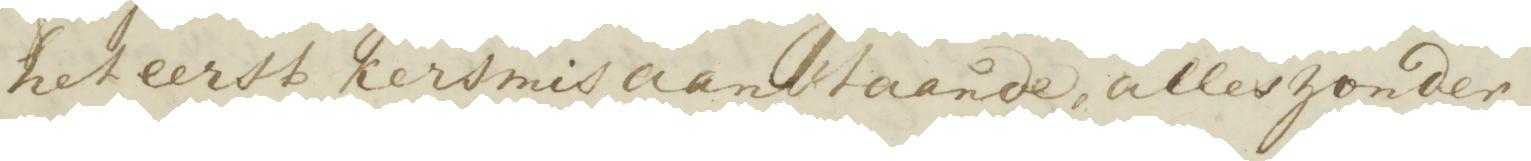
het eerst kersmis aanstaande, alles zonder
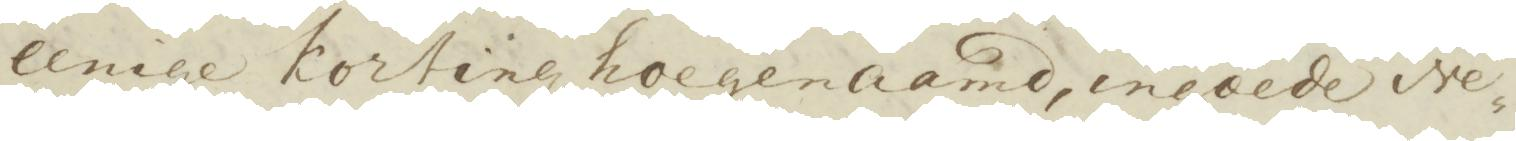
eenige korting hoegenaamd, in goede Ne„
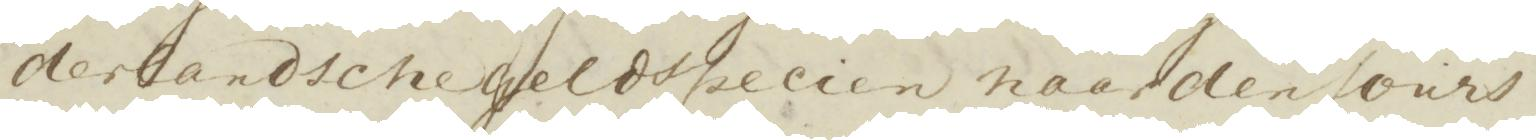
derlandsche geldspecien naar den Cours
